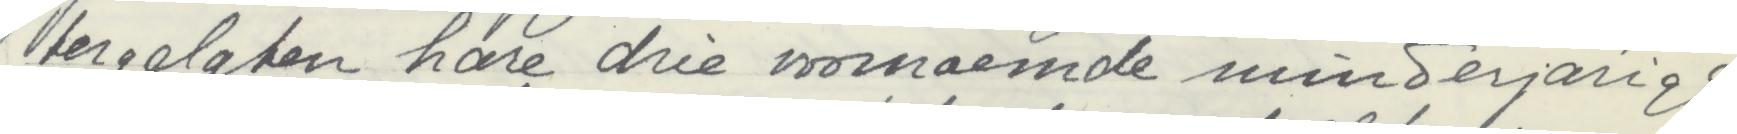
tergelaten hare drie voornoemde minderjarige
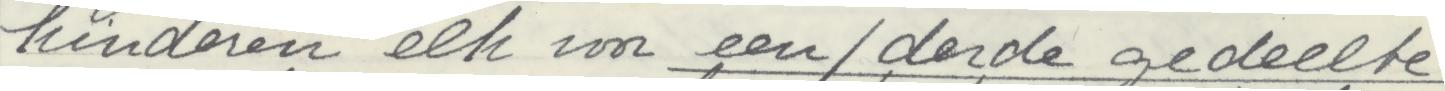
kinderen elk in een / derde gedeelte
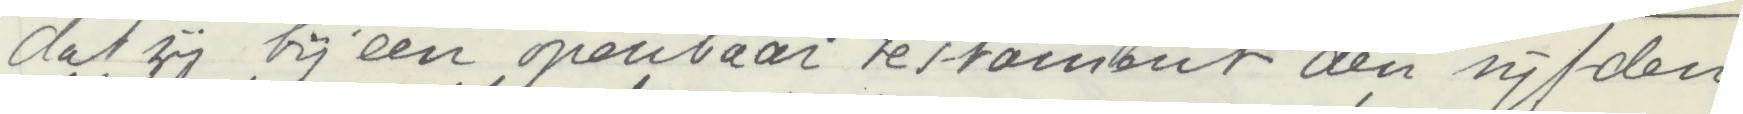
dat zij bij een openbaar testament den vijfden
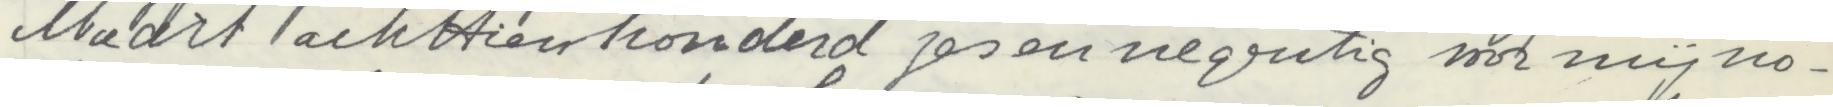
Maart achttien honderd zes en negentig voor mij no-
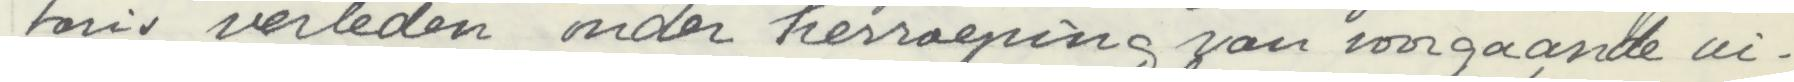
taris verleden, onder herroeping van voorgaande ui
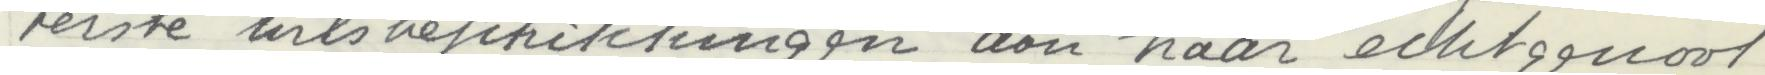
terste wils beschikkingen aan haar echtgenoot
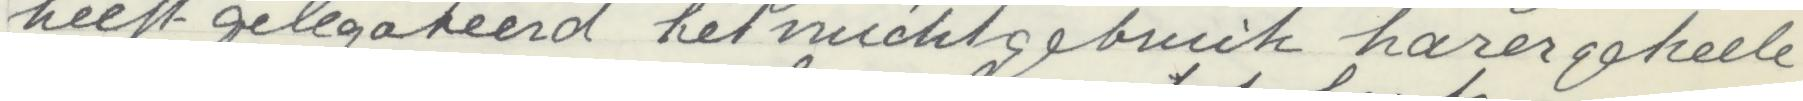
heeft gelegateerd het vruchtgebruik harer geheele
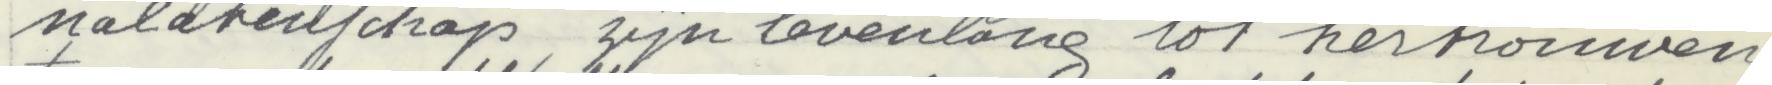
nalatenschap, zijn levenlang tot hertrouwen
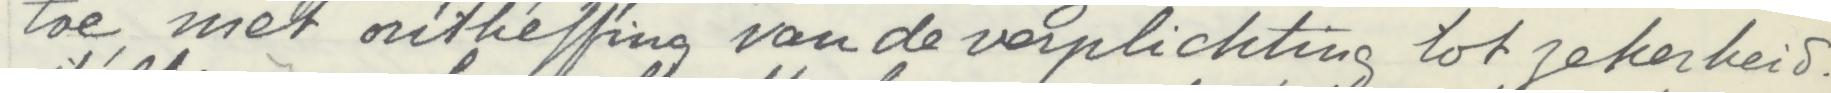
toe, met ontheffing van de verplichting tot zekerheid
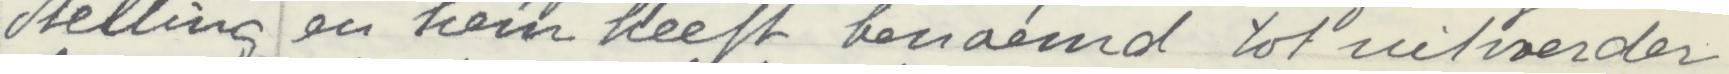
stelling en hem heeft benoemd tot uitvoerder
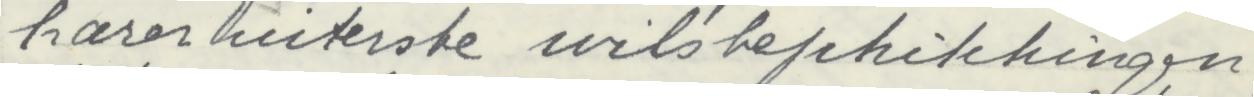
harer uiterste wilsbeschikkingen
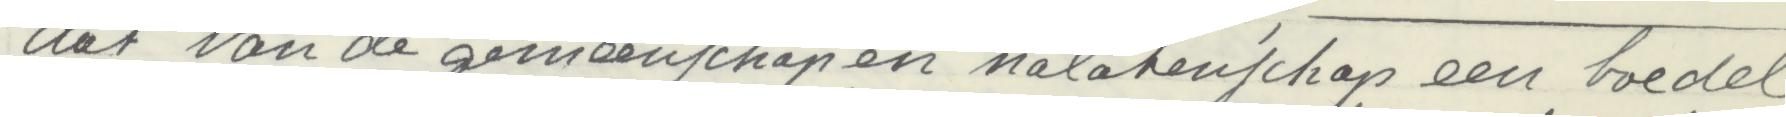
dat van de gemeenschap en nalatenschap een boedel
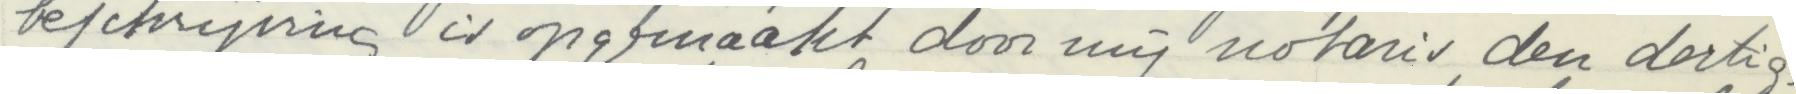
beschrijving is opgemaakt door mij notaris den dertig
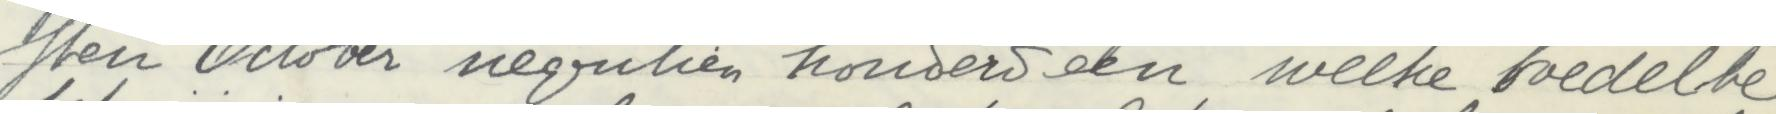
sten October negentien honderd een, welke boedelbe
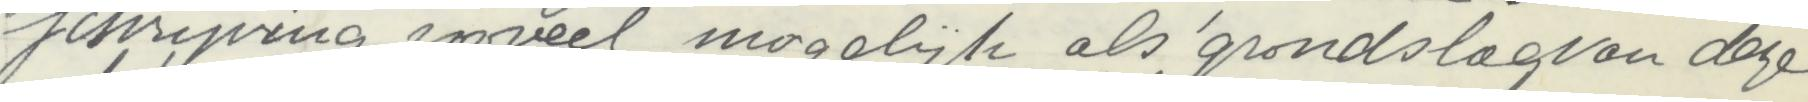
schrijving zooveel mogelijk als grondslag van deze
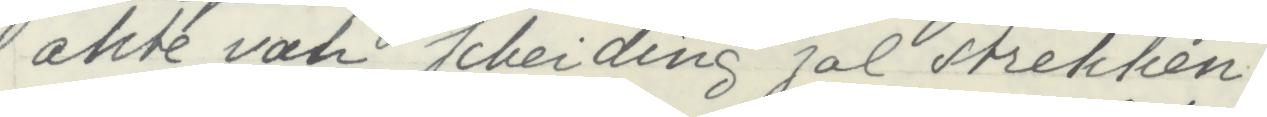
akte van scheiding zal strekken
